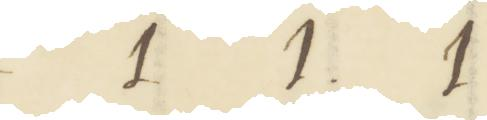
1. 1. 1
